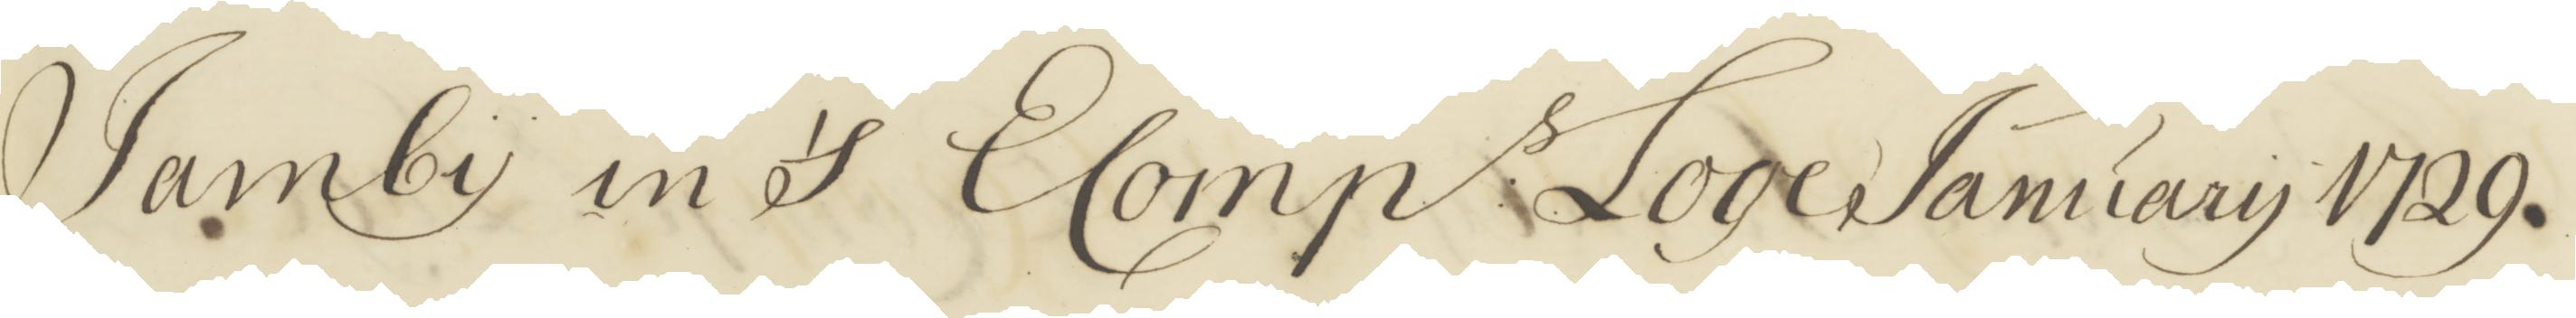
Jambij in ’s EComp:s Loge Januarij 1729.
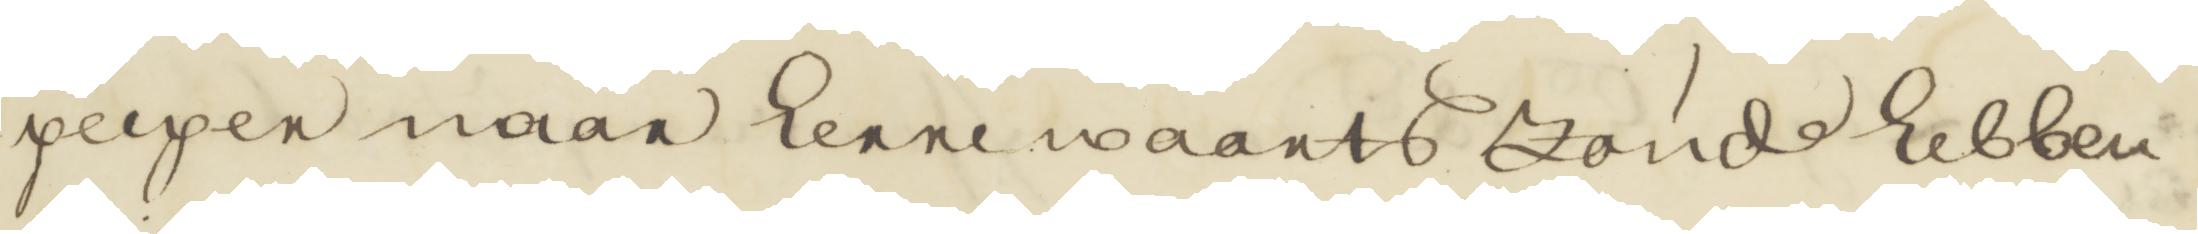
peeper naar herre waarts zoude hebben
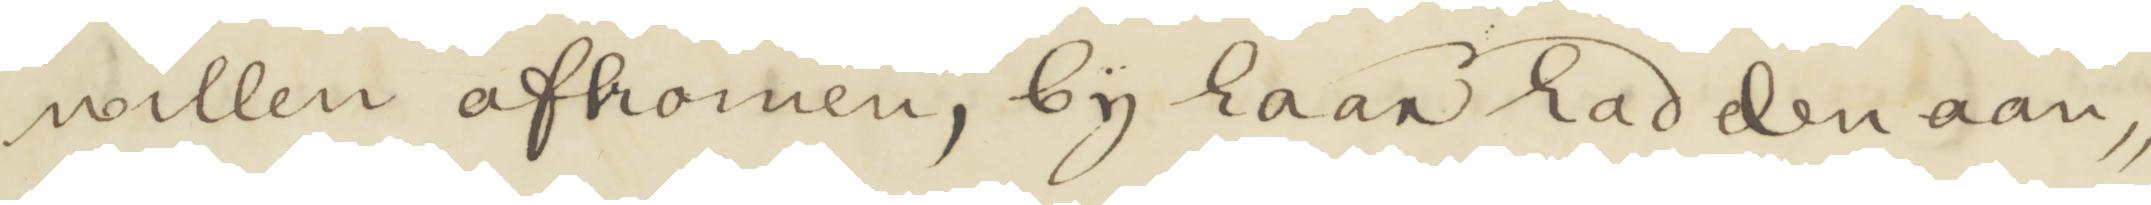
willen afkomen, bij haar had den aan„
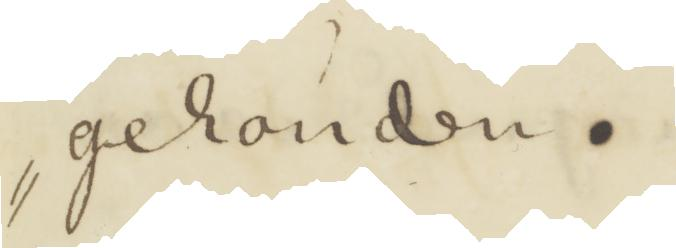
„gehouden.
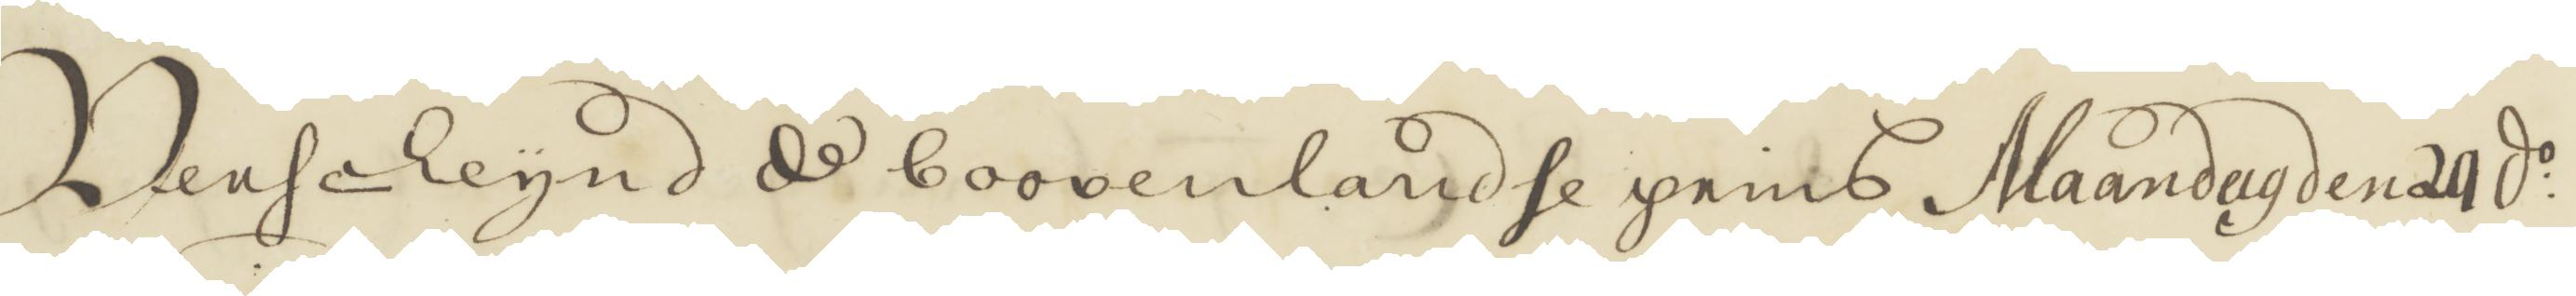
Verscheijnd de boovenlandse prins Maandagden 24 d:o
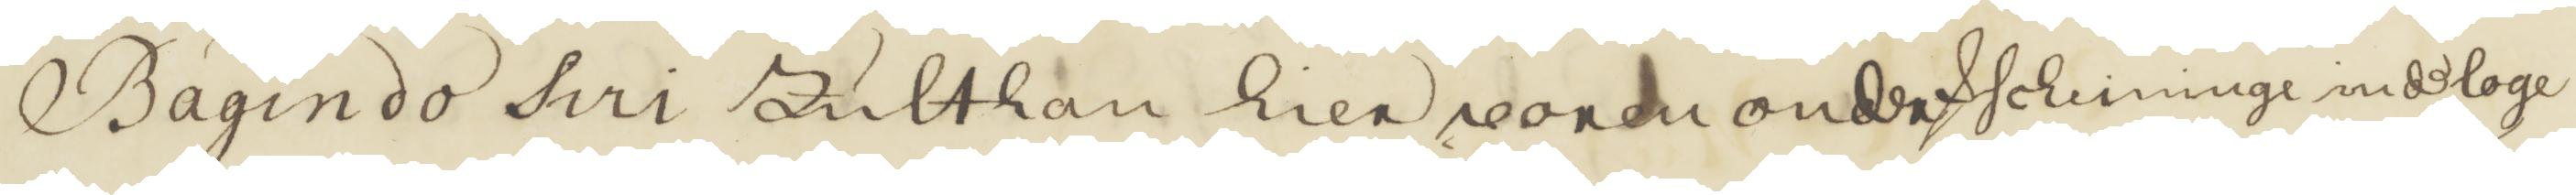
Bagindo Siri Zultaan hier voren onderer verscheininge in de loge
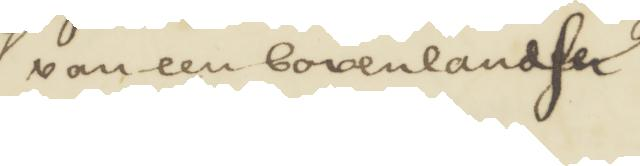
van een bovenlandse
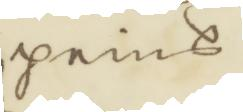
prins
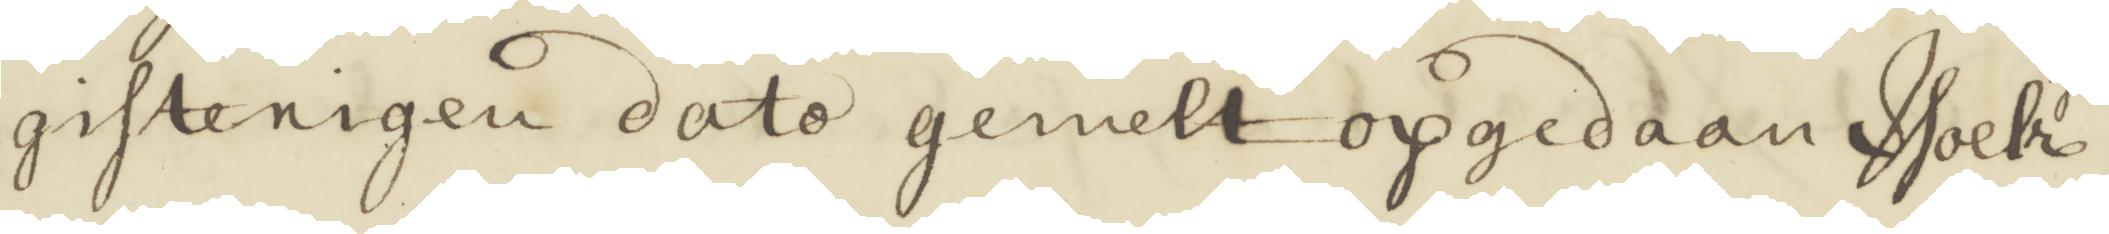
gisterigen dato gemelt op gedaan versoek
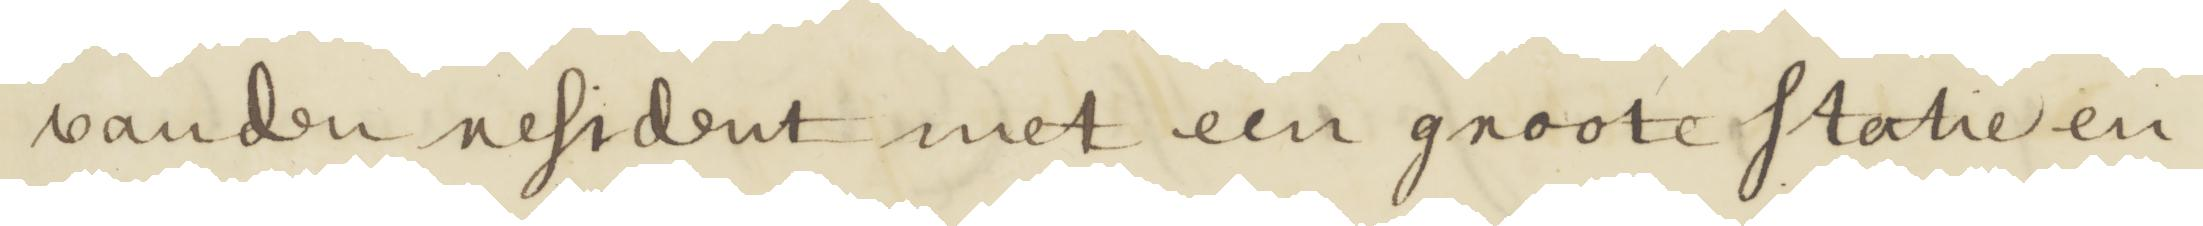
van den resident met een groote statie en
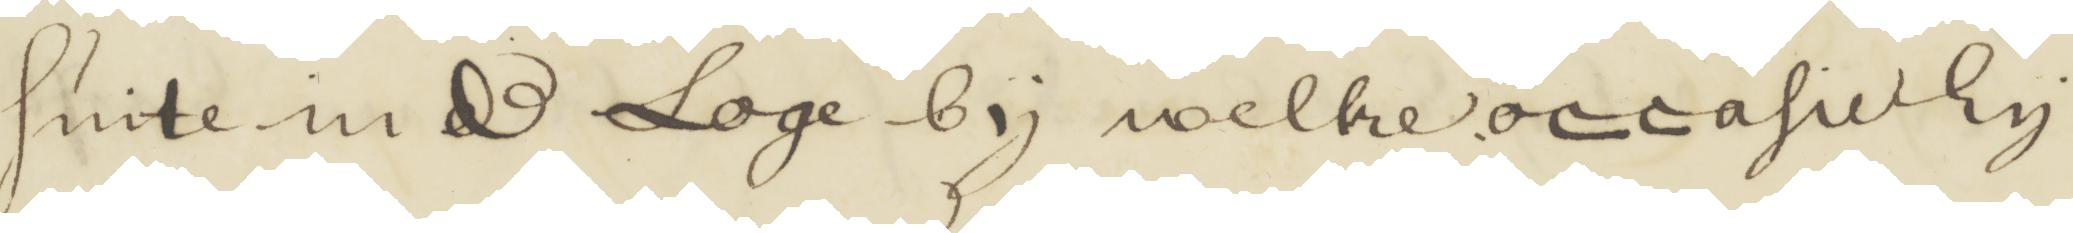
suite in de Loge bij welke occasie hij
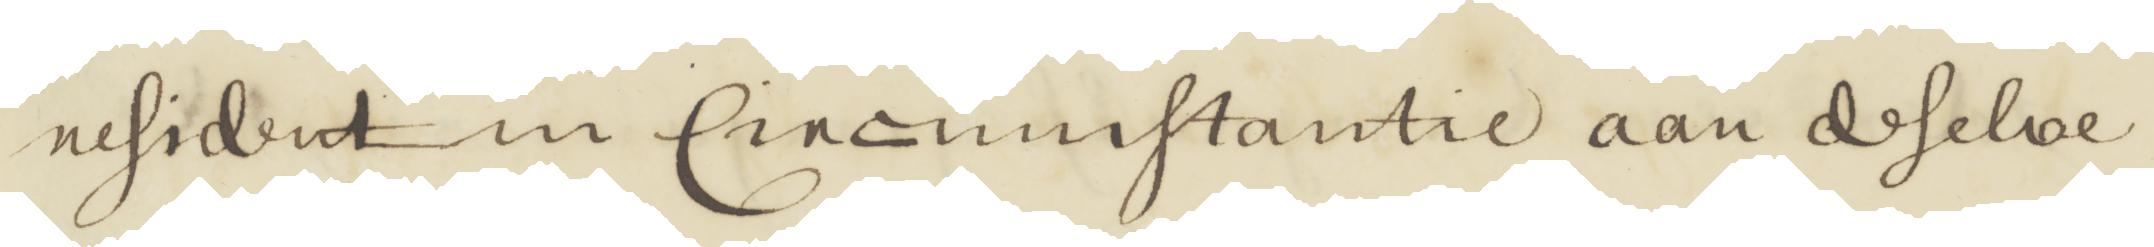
resident in circumstantie aan deselve
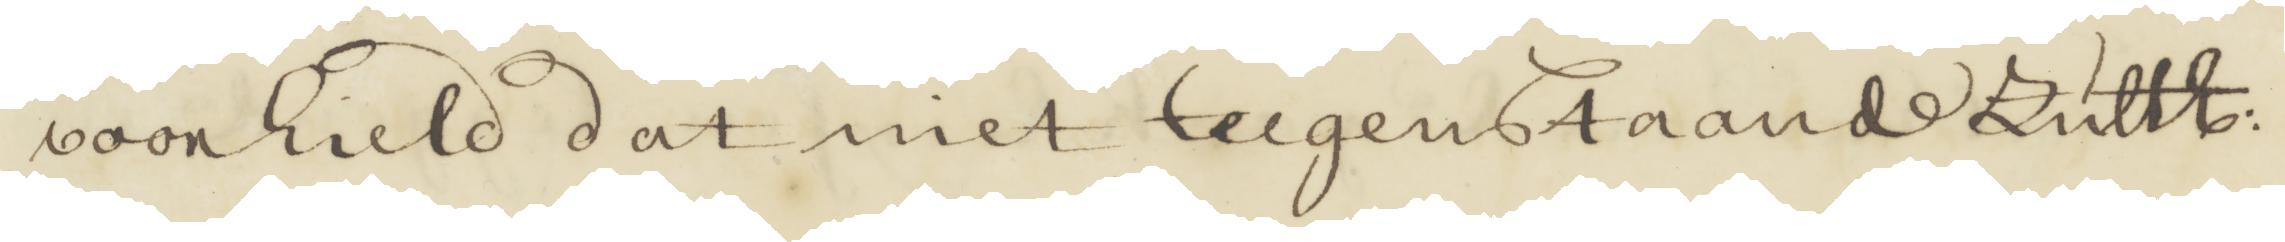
voorhield dat niet teegenstaande zullh.
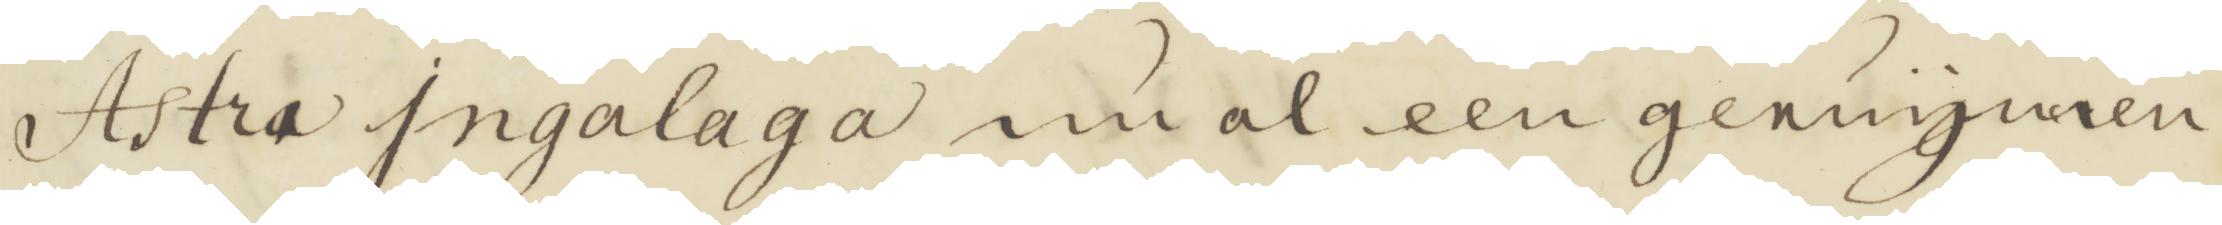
Astra Jngalaga nu al een geruijmen
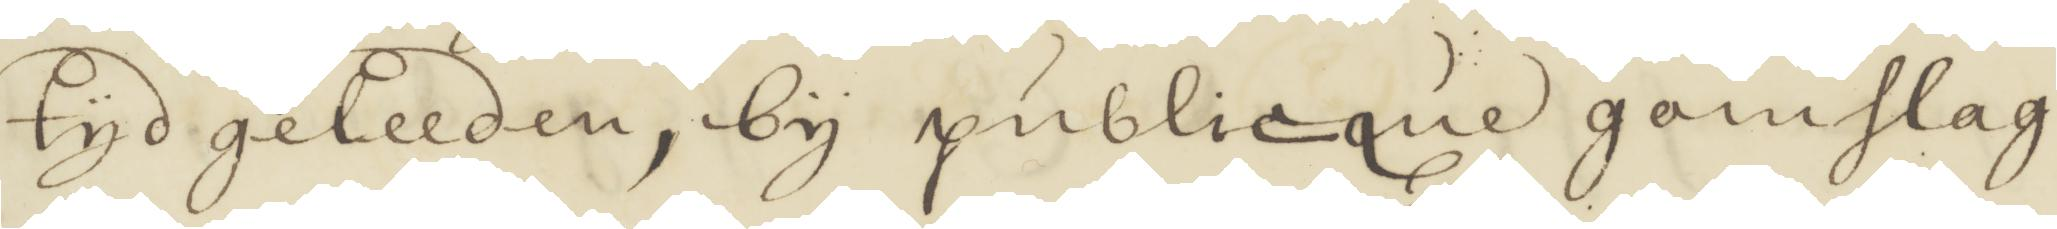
tijd geleeden, bij publicque gomslag
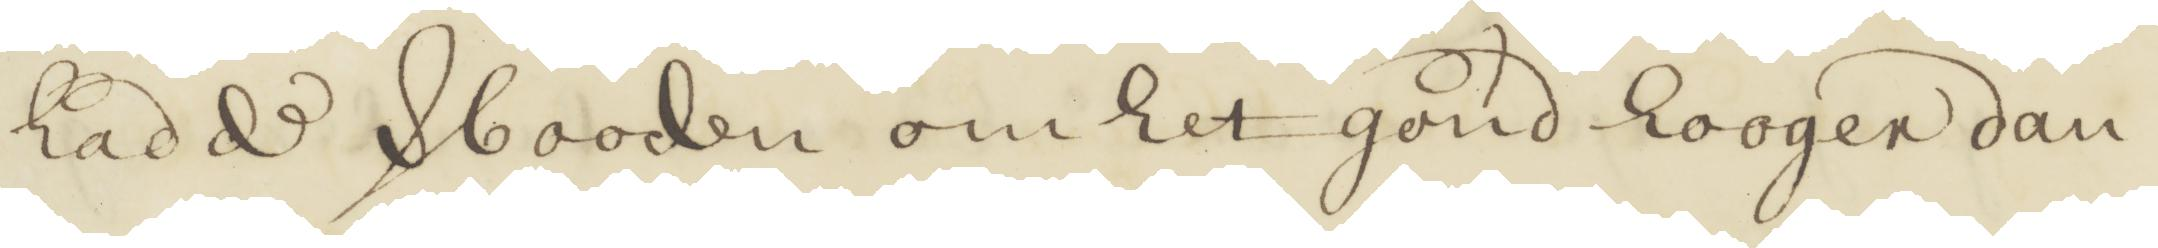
hadde verbooden om het goud hooger dan
